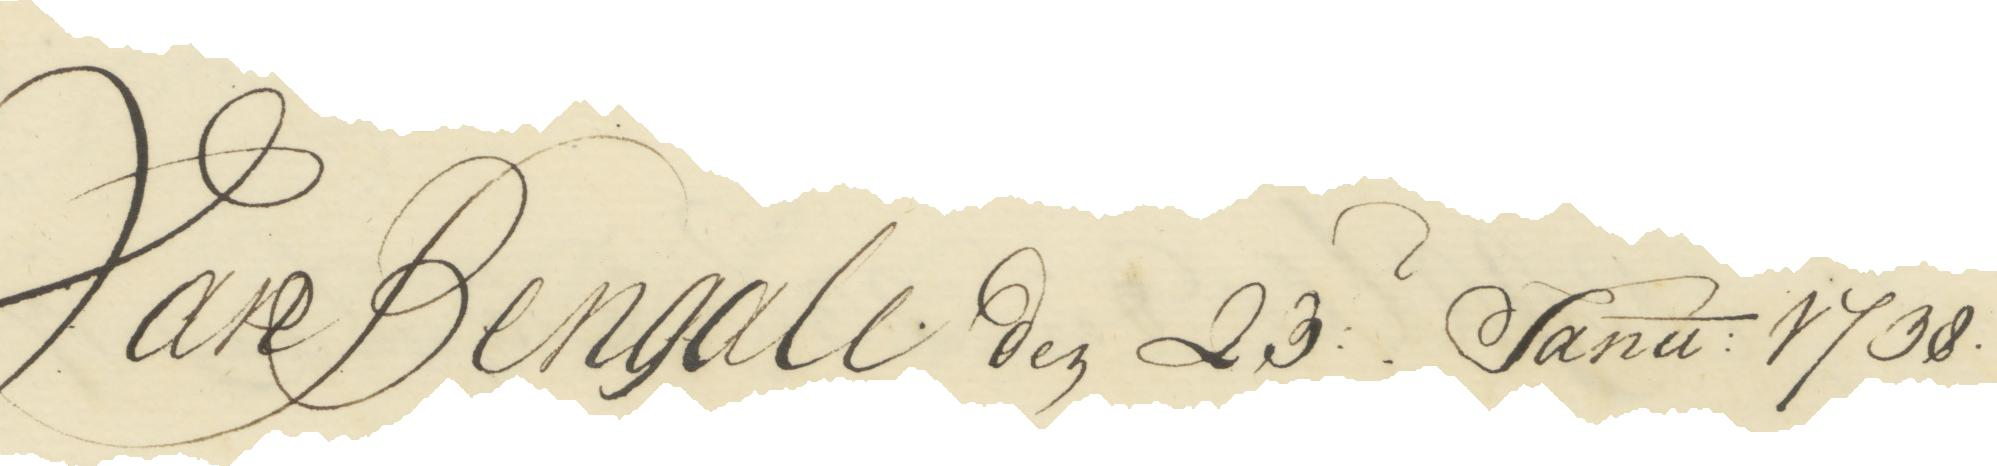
Van Bengale den 23:'. Janu: 1738.
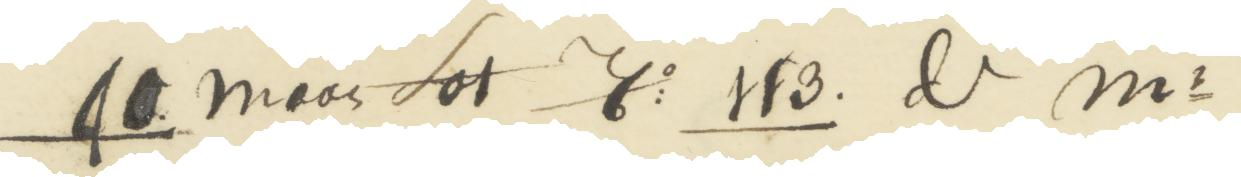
40. maas tot C:o 113. de m=n
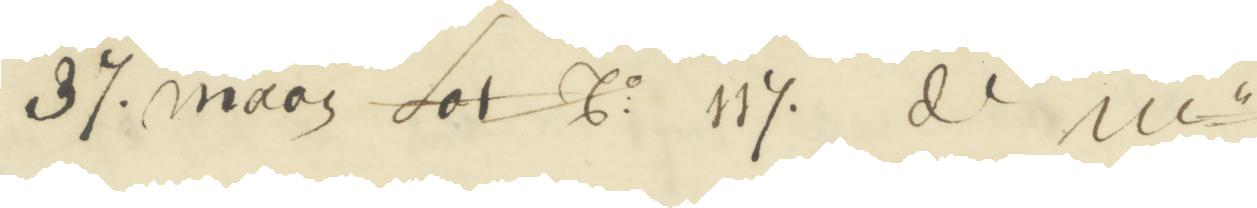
37. maas tot C:o 117. de m=n
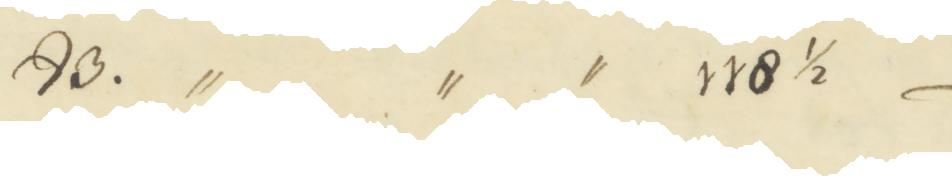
83. „ „ „ 118½ _:o
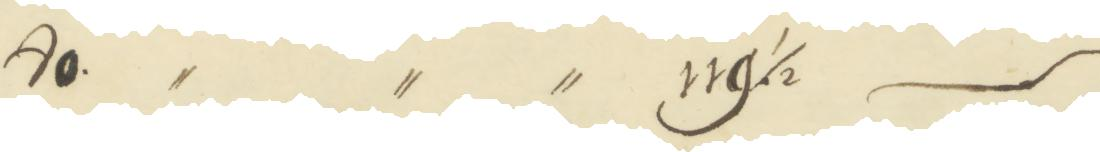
80. „ „ „ 119½ _:o
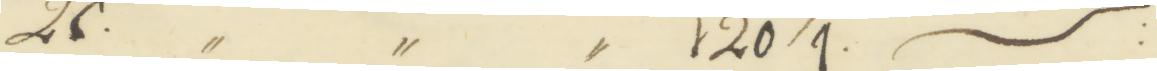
25. „ „ „ 120¼. _:o
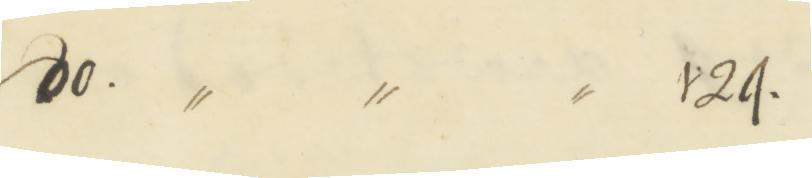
80. „ „ „ 124. _:o
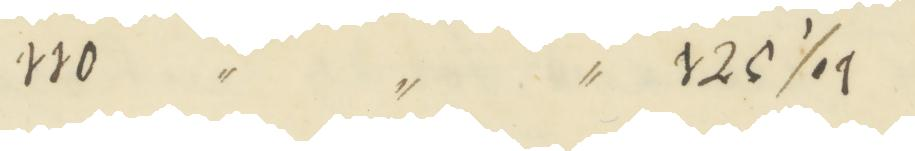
110 „ „ „ 125 1/14 _:o
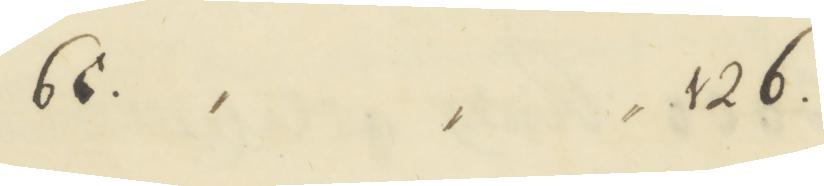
65. „ „ „ 126. _:o
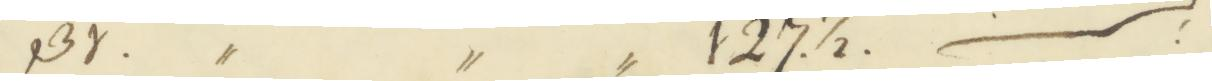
31. „ „ „ 127.½. _:o
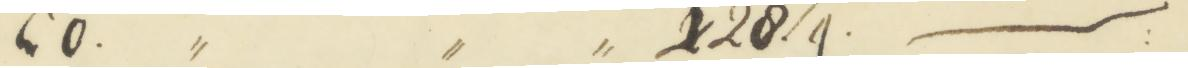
50. „ „ „ 128¾. _:o
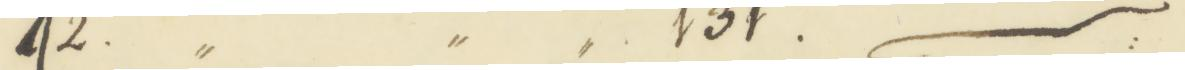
42. „ „ „ 131. _:o
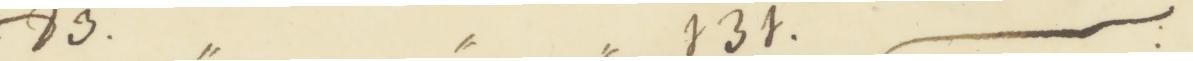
83. „ „ „ 131. _:o
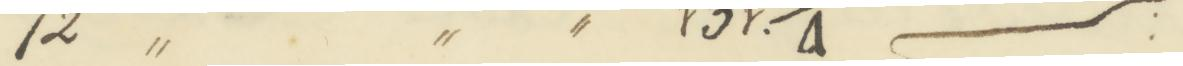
72 „ „ „ 131.¼ _:o
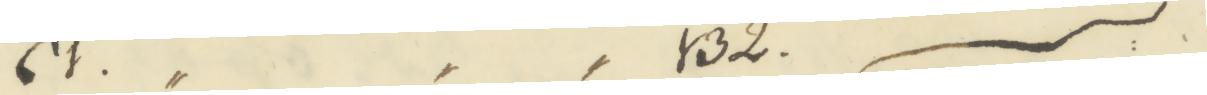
51. „ „ „ 132. _:o
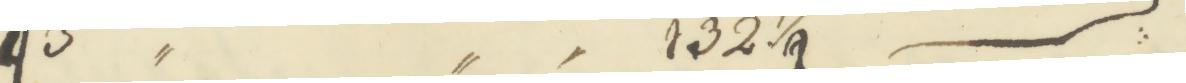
43 „ „ „ 132½ _:o
